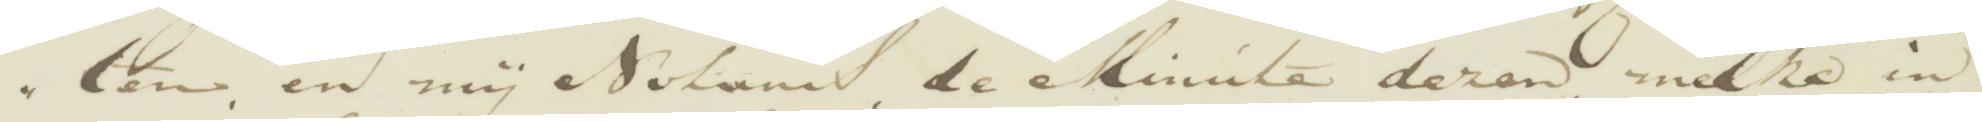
„ten, en mij Notaris de Minute dezen welke in
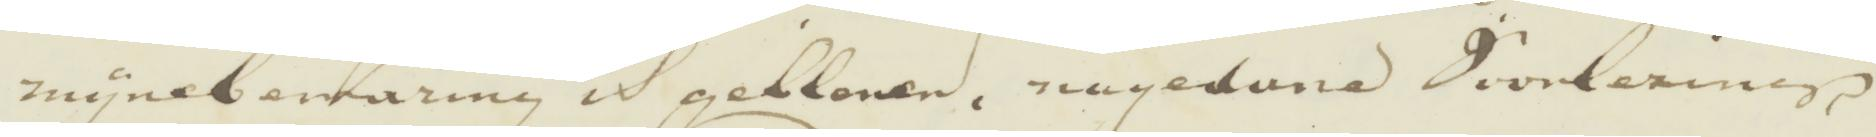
mijne bewaring is gebleven, nagedane Voorlezing
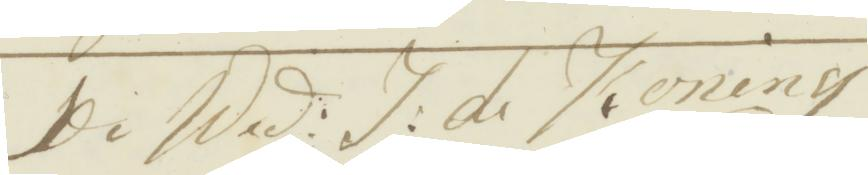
De Wed: I: de Koning
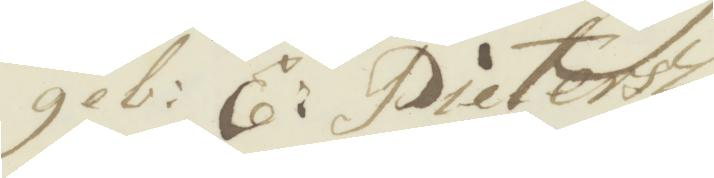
geb: E: Dietersz
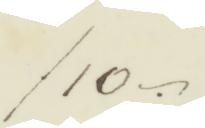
ƒ10 —
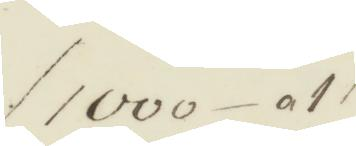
ƒ 1000 — a 11
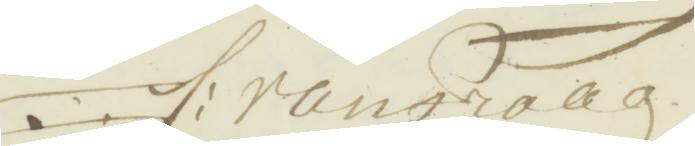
C: van sraag
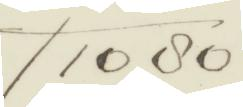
ƒ1080
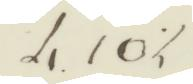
4.10½
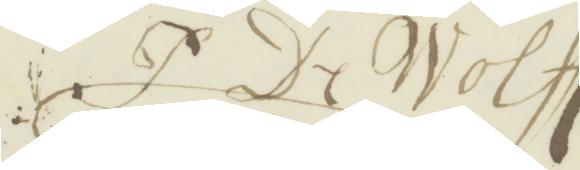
I De Wolf
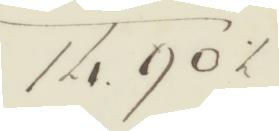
14.90½
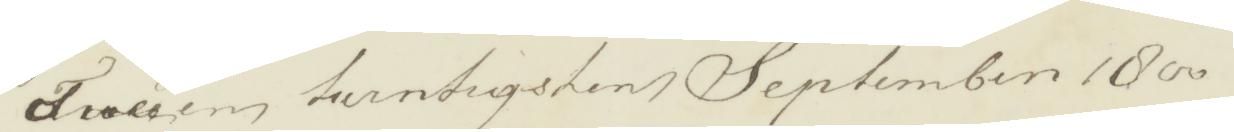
Tweeen twintigsten September 1800
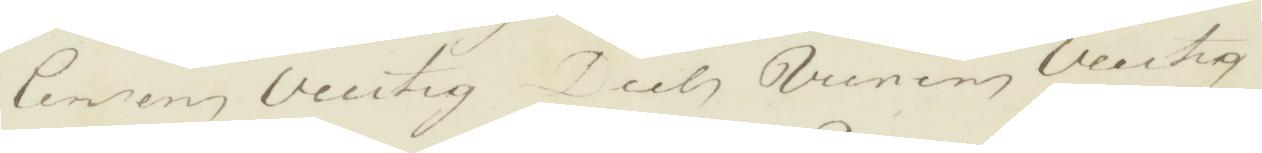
Eenen veertig Deel Vieren veertig
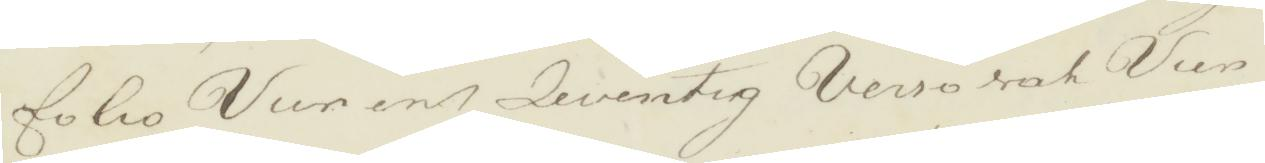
folio Vier en Zeventig Verso vak Vier
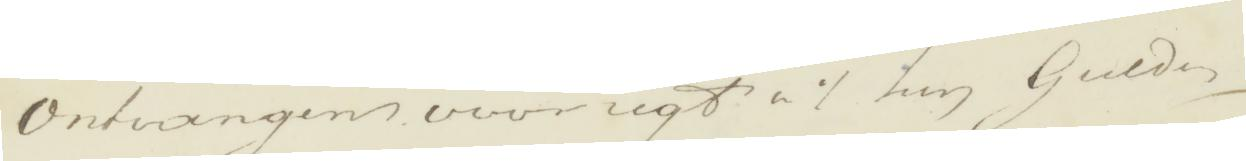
Ontvangen voor regt a % tien Gulden
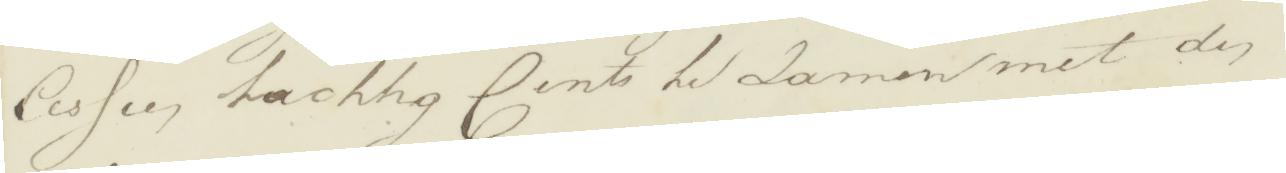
Cessien tachtig Cents te zamen met den
